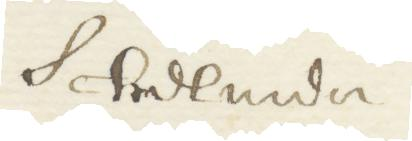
schelmen
